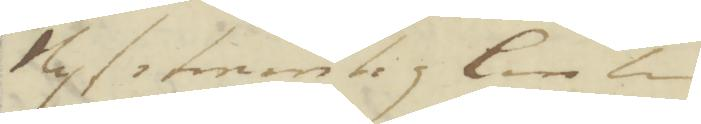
Vyf en twintig Cents
